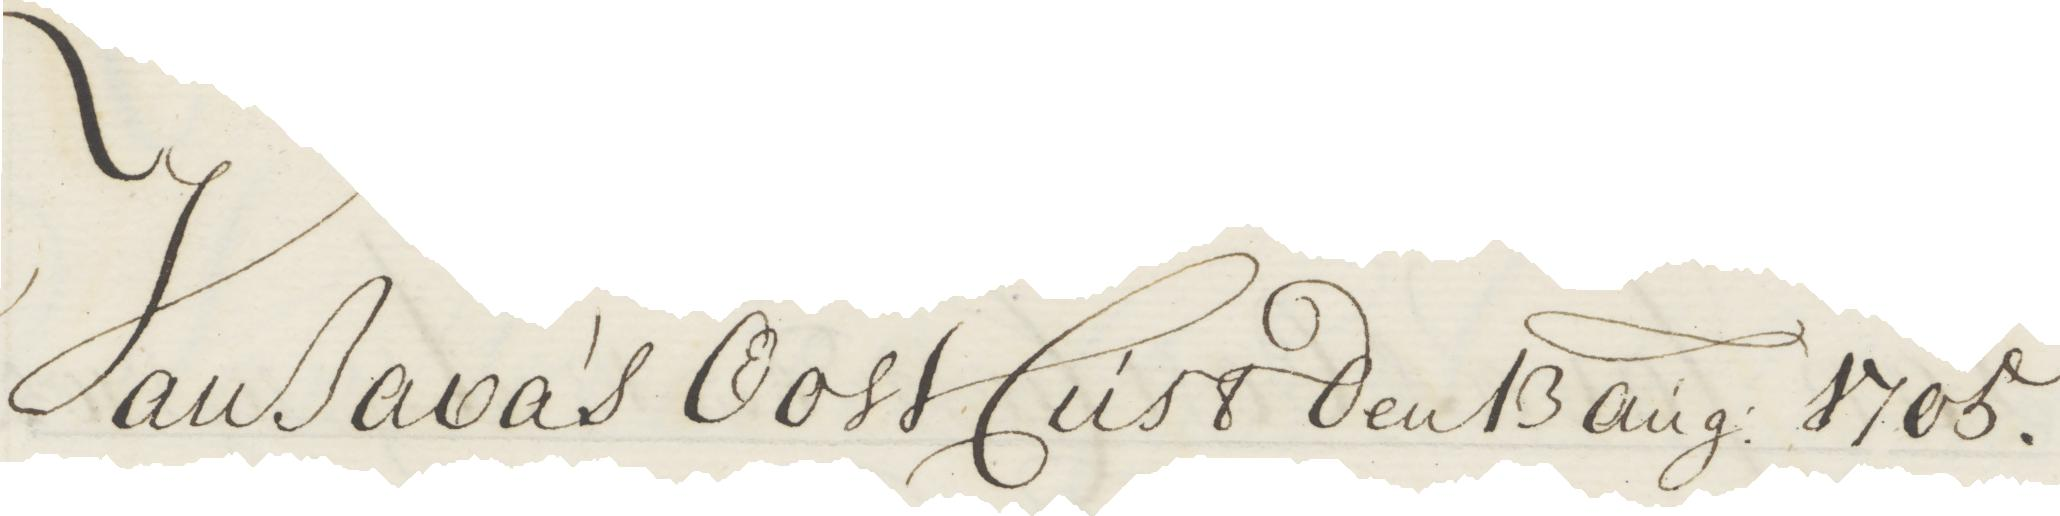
Van Iava's Oost Cust Den 13 aug: 1705.
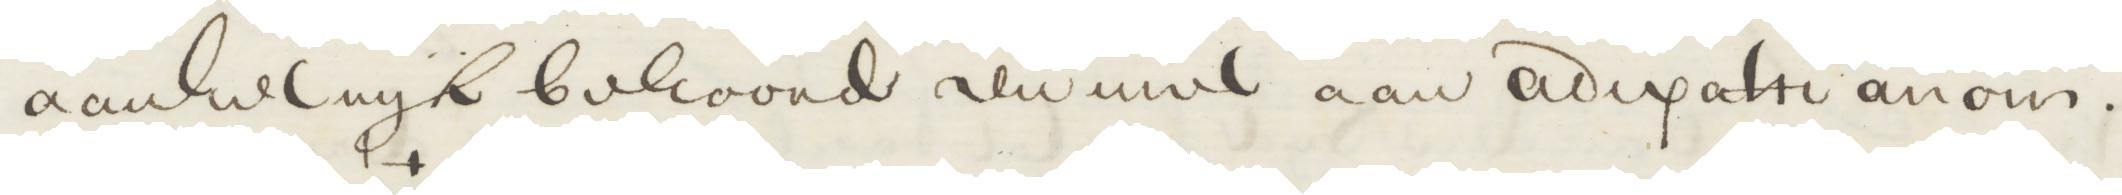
aan het rijk behoorde en niet aan adipatti anom
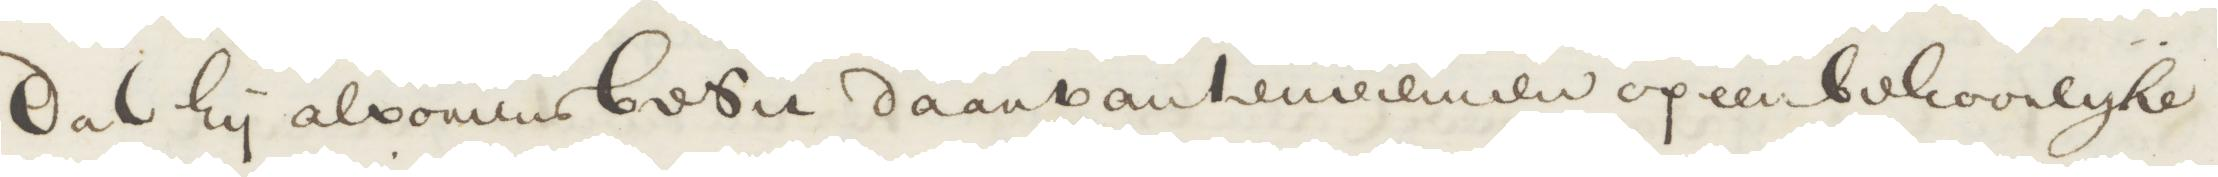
Dat hij alvorens besit daarvan te neemen op een behoorlijke
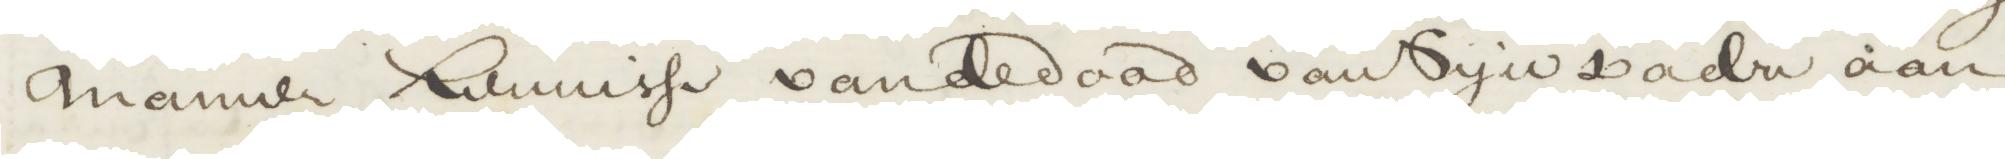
Manier kennisse van de dood van sijn vader aan
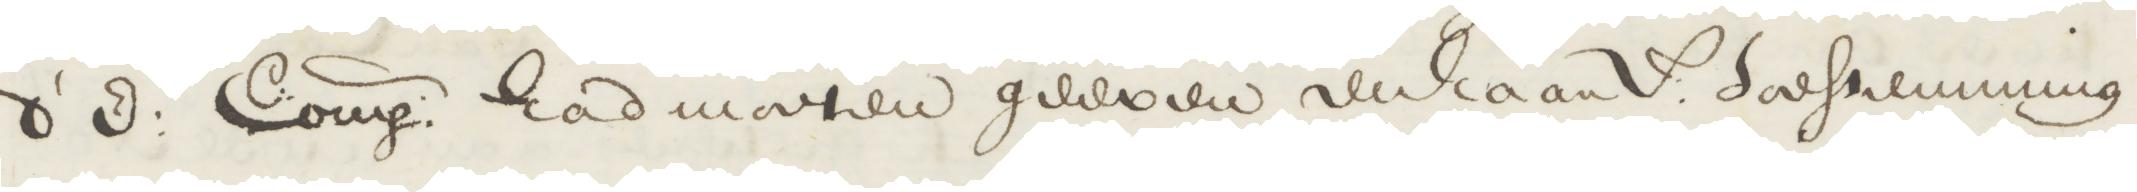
d’E: Comp: had moeten geeven en haar E: toestemming
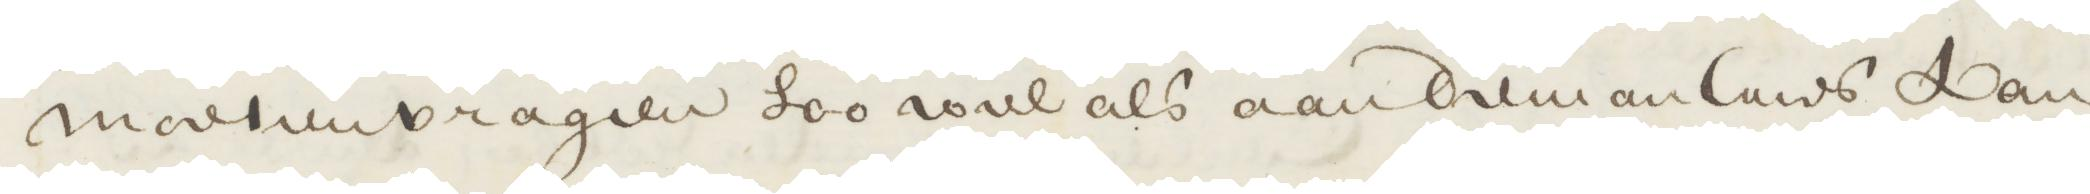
moeten vragen soo wel als aan de mantries van
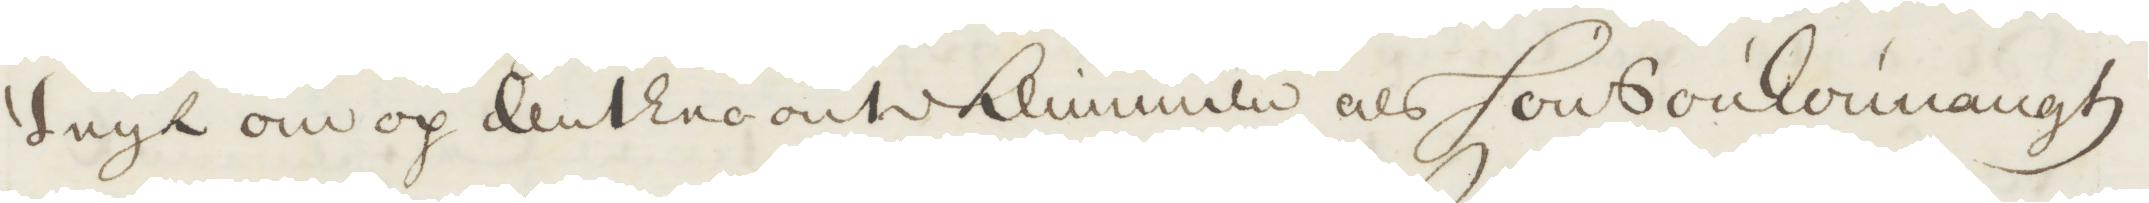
't rijk om op den throon te klimmen als sousouhounangh
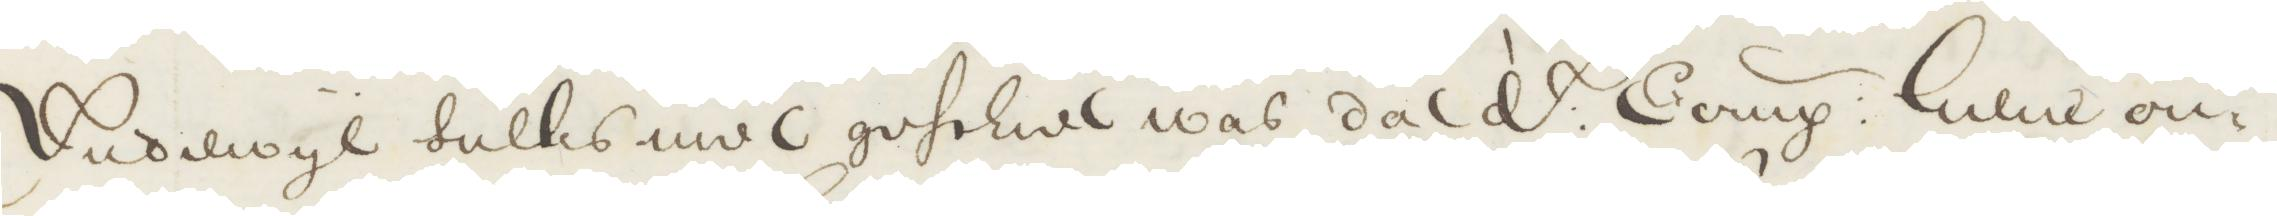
En dewijl sulks niet geschiet was dat d'E: Comp: here on„
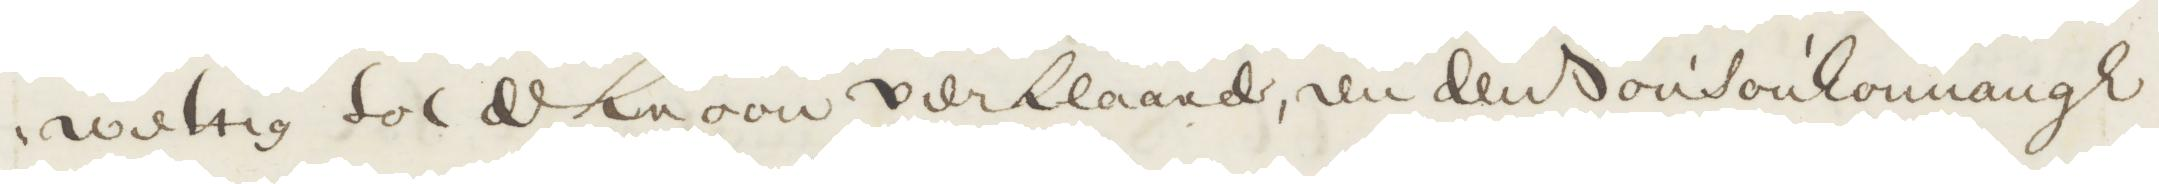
„wettig tot de kroon verklaarde, en den sousouhounangh
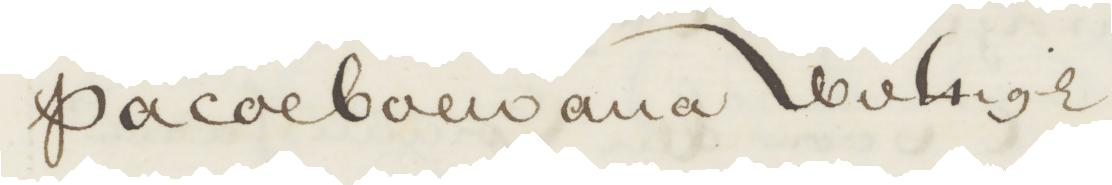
Pacoeboewana wettigh
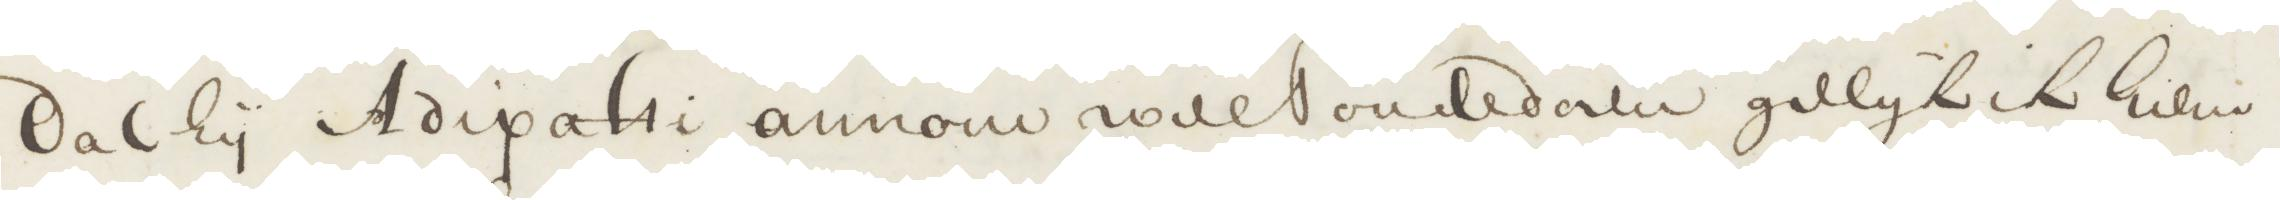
Dat hij Adipatti annom wel soude doen gelijk ik hem
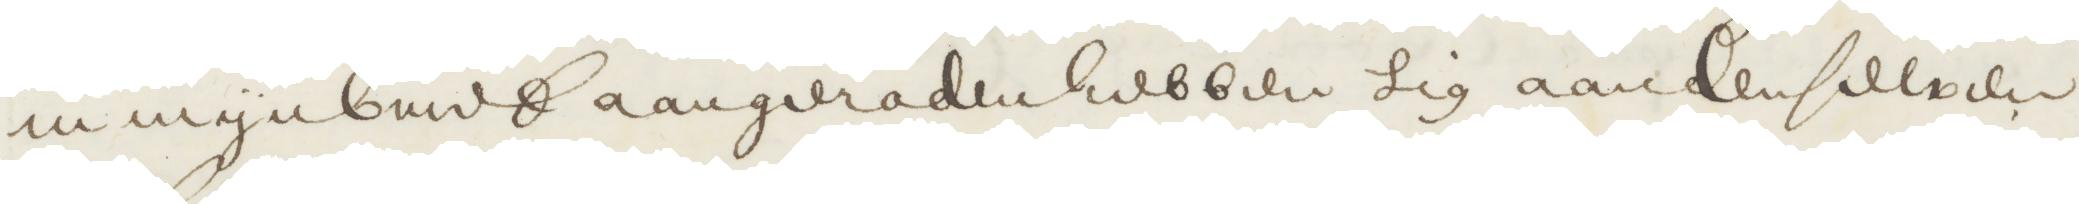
in mijn brief aangeraden hebben sig aan denselven
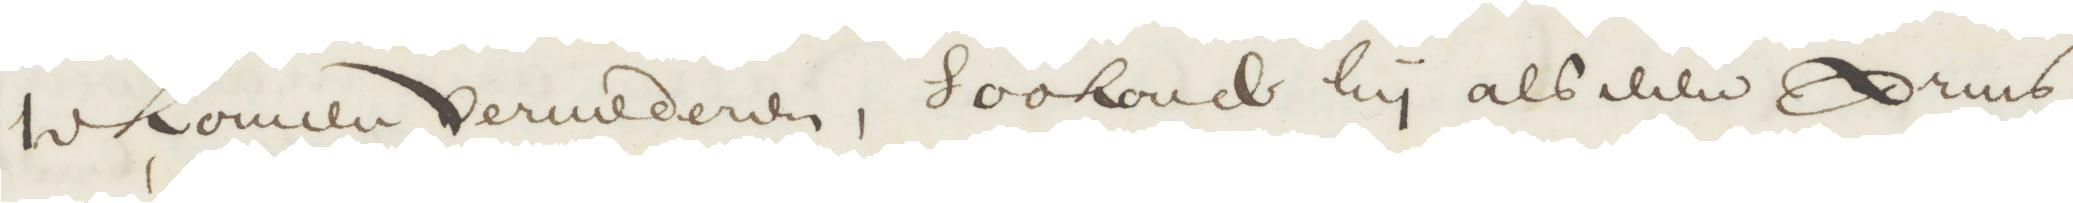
te komen vernederen, soo konde hij als een prins
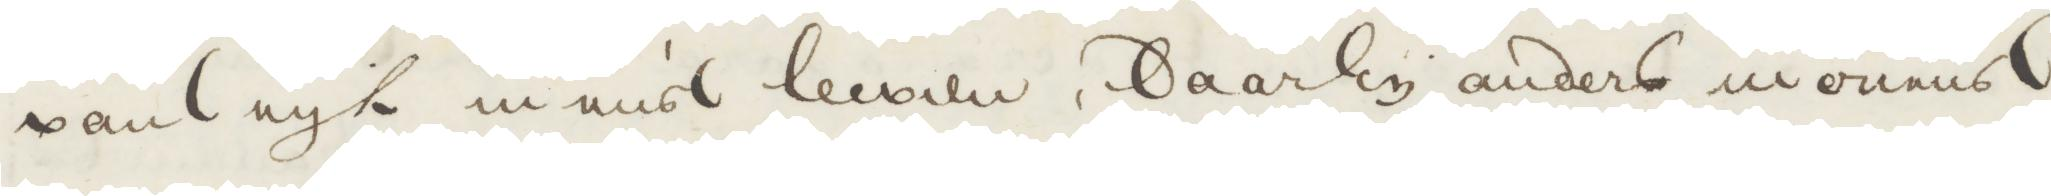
van 't rijk in rust leeven, daar hij anders in onrust
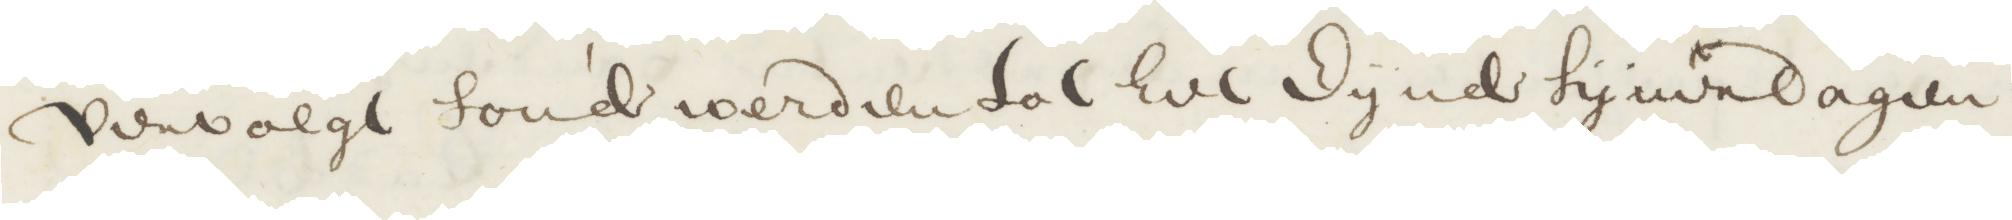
vervolgt soude werden tot het Eijnde sijner dagen
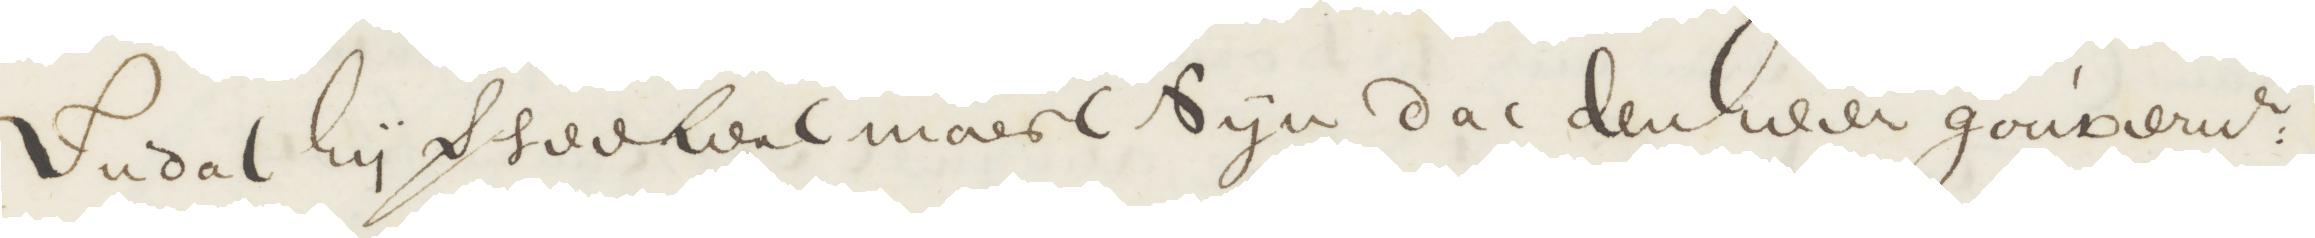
En dat hij verseekert moest sijn dat den heer gouvern:r
